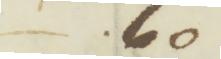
-.60
